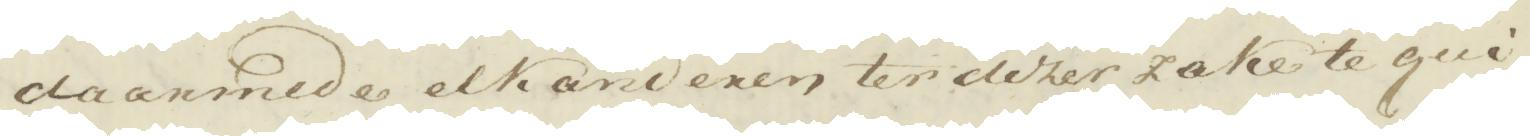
daarmede elk anderen ter dezer zake te qui
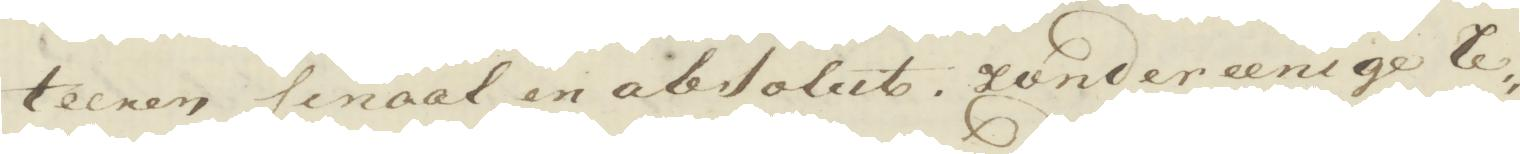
teeren finaal en absolut, zonder eenige re„
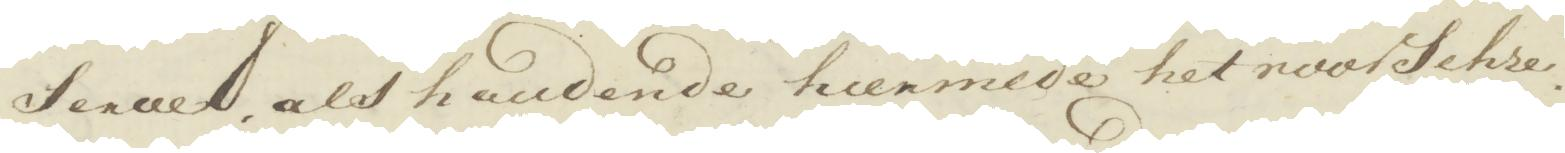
serve, als houdende hiermede het voorSchre„
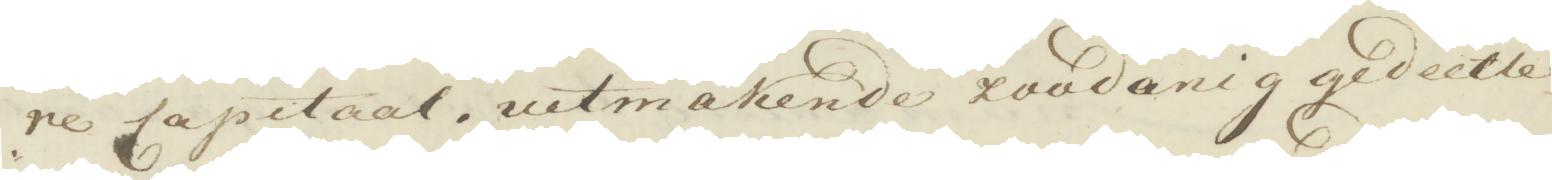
„ve Capitaal, uitmakende zoodanig gedeelte
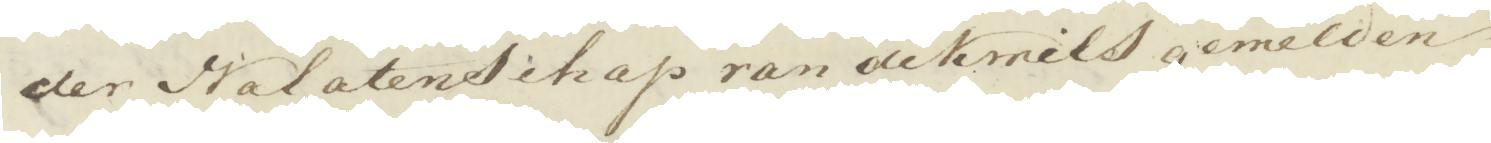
der Nalatenschap van dikwils gemelden
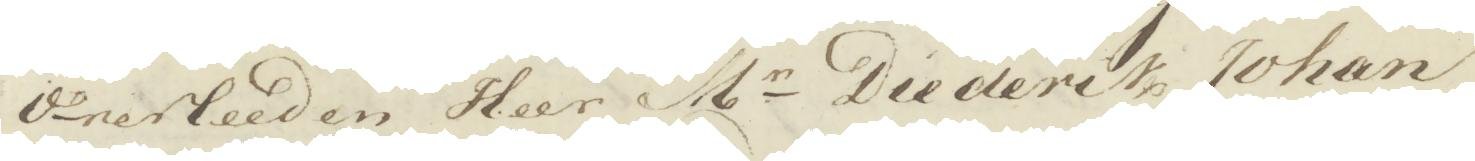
Overleeden Heer M=r Diederik Johan
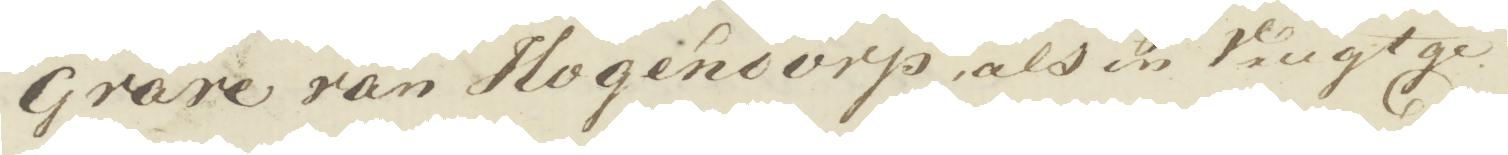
Grave van Hogendorp, als in Vrugtge,
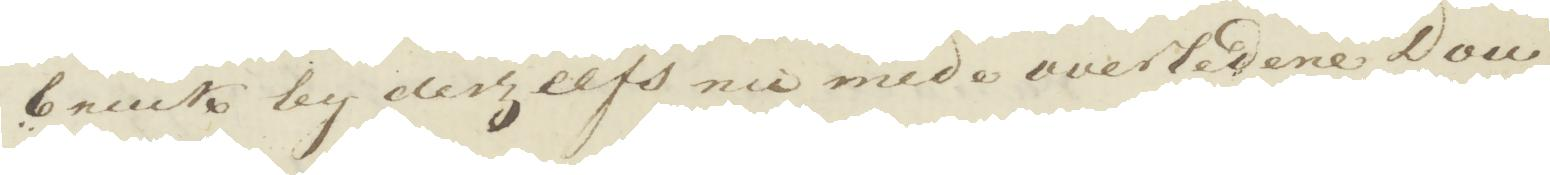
„bruik by derzelfs nu mede overledene Dou
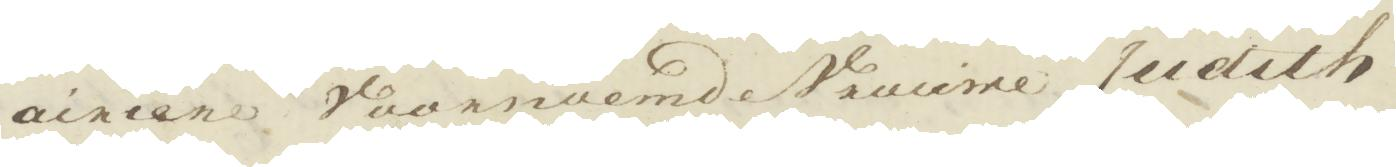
,airiere Voornoemde Vrouwe Judith
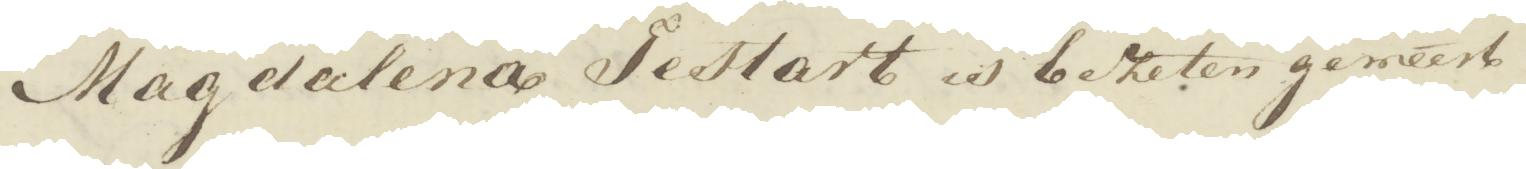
Magdalena Testart is bezeten geweest
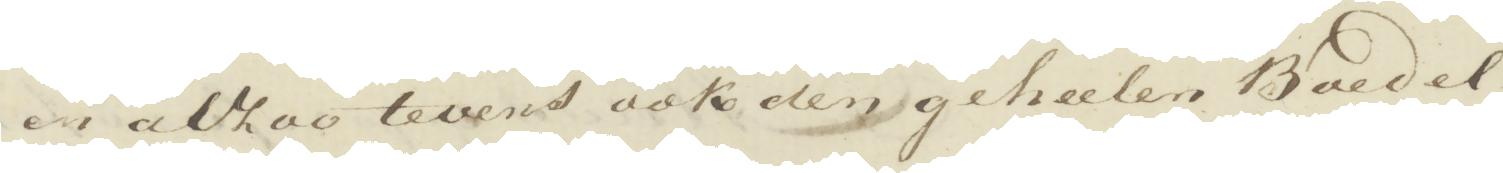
en alzoo tevens ook den geheelen Boedel
